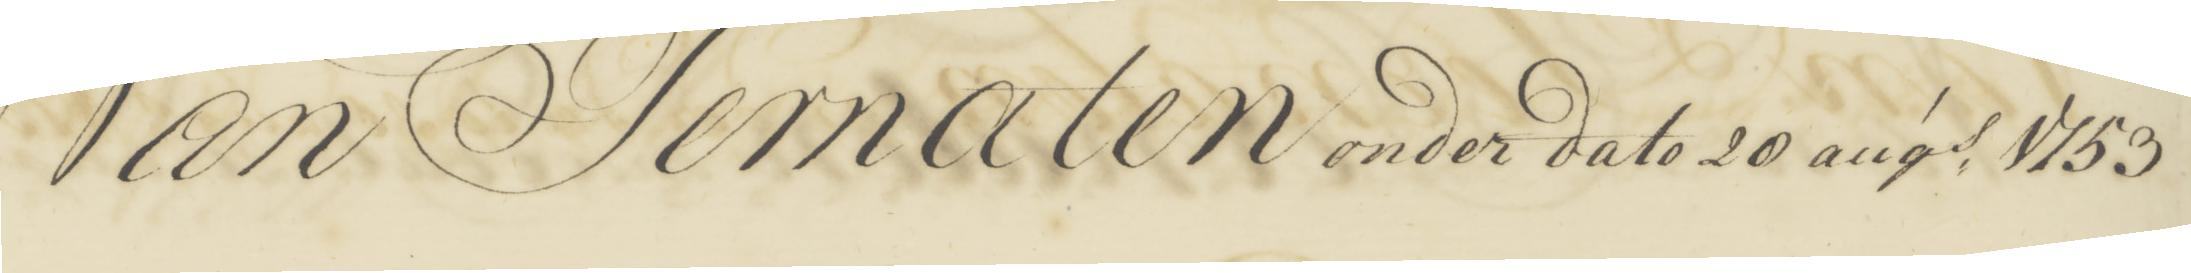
van Ternaten onder dato 20 aug„s 1753
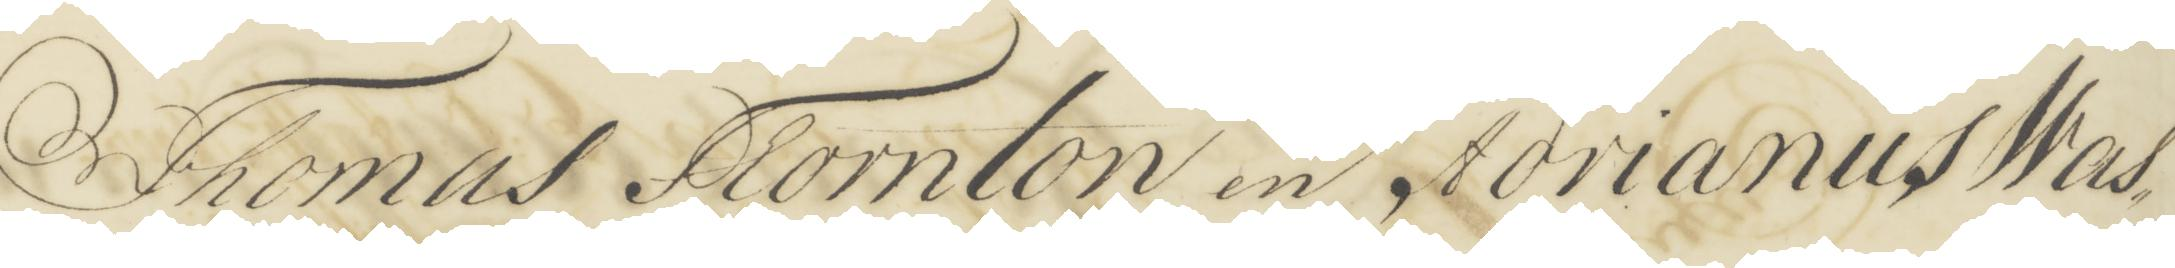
Thomas Thornton en Adrianus Was„
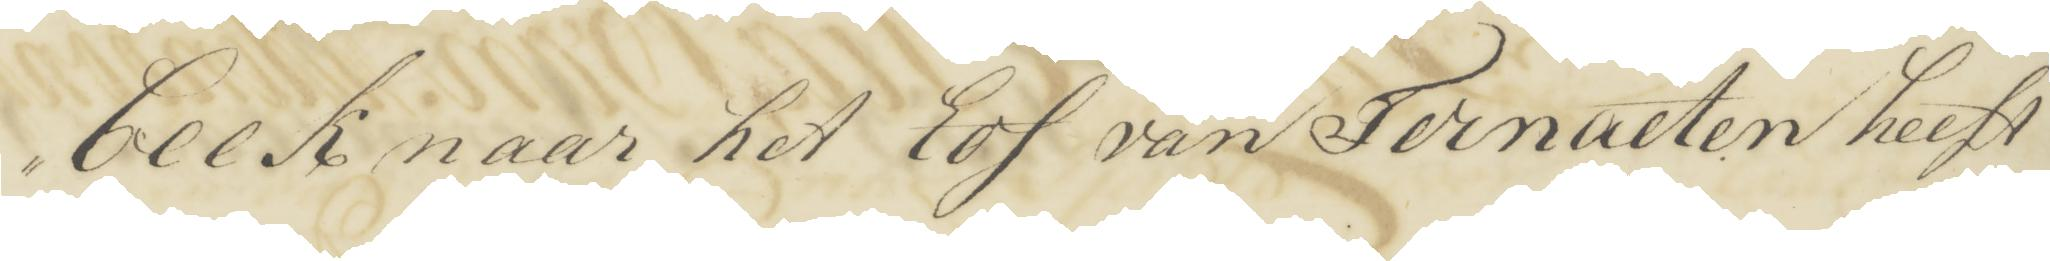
„beek naar het hof van Ternaeten heeft
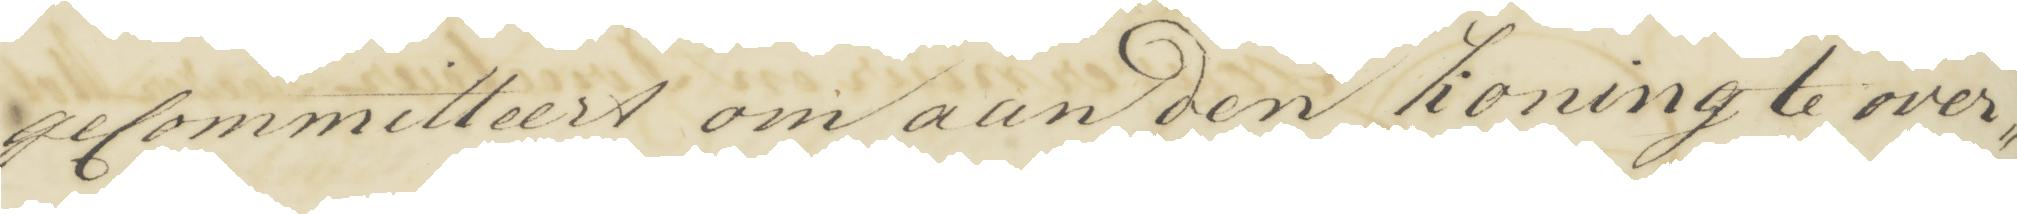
gecommitteert om aan den Koning te over„
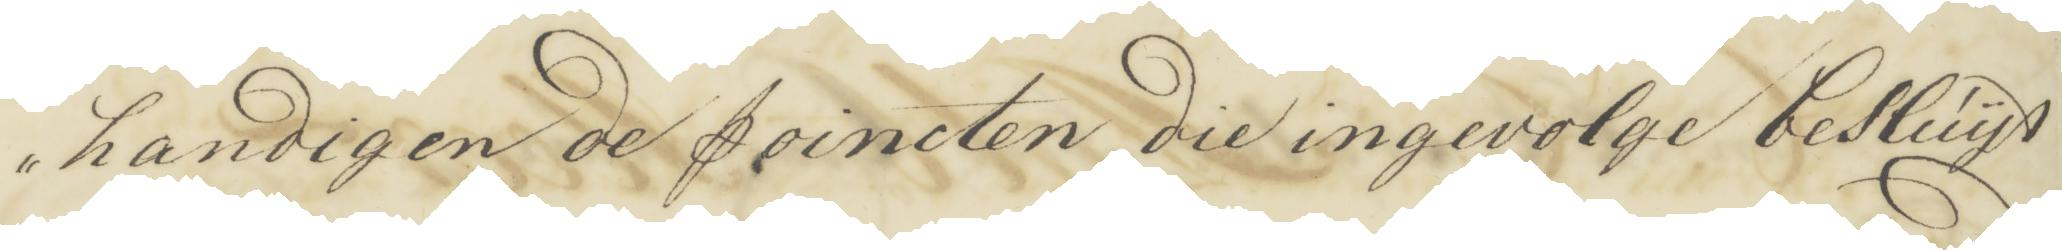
„handigen de poincten die ingevolge besluijt
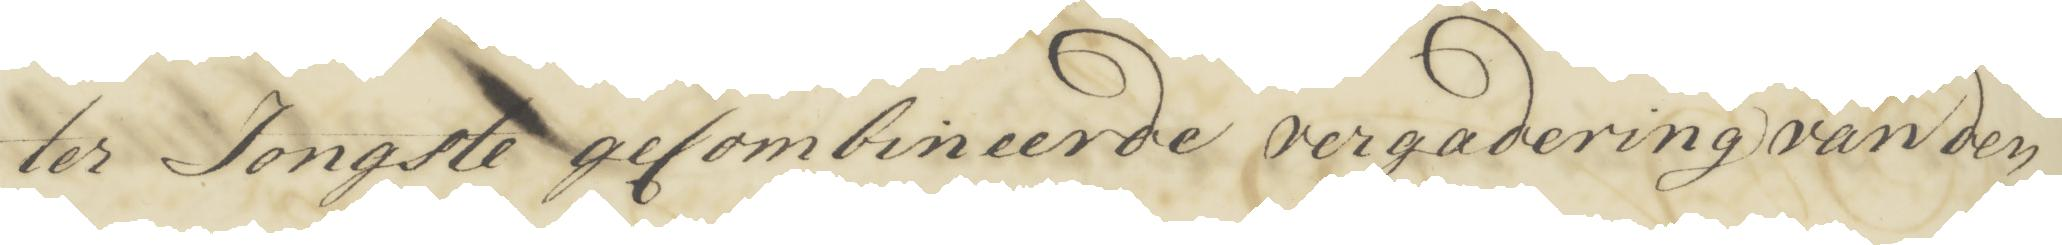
ter Iongste gecombineerde vergadering van den
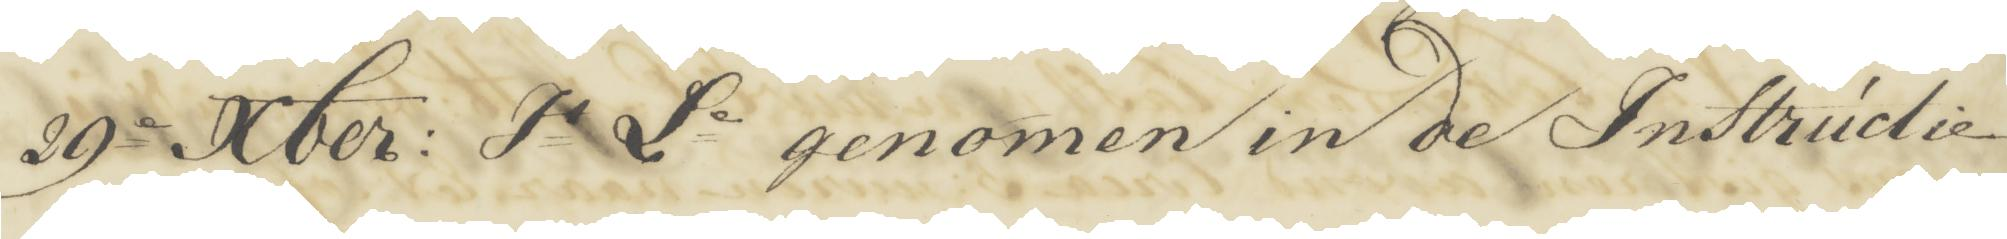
29=e xber: I=t L=e genomen in de Instructie
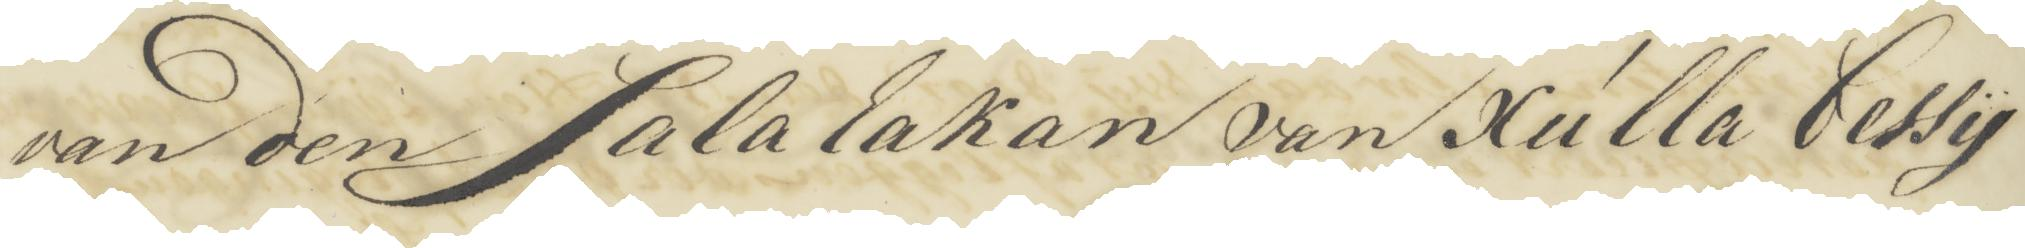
van den Salahakan van Xulla bessij
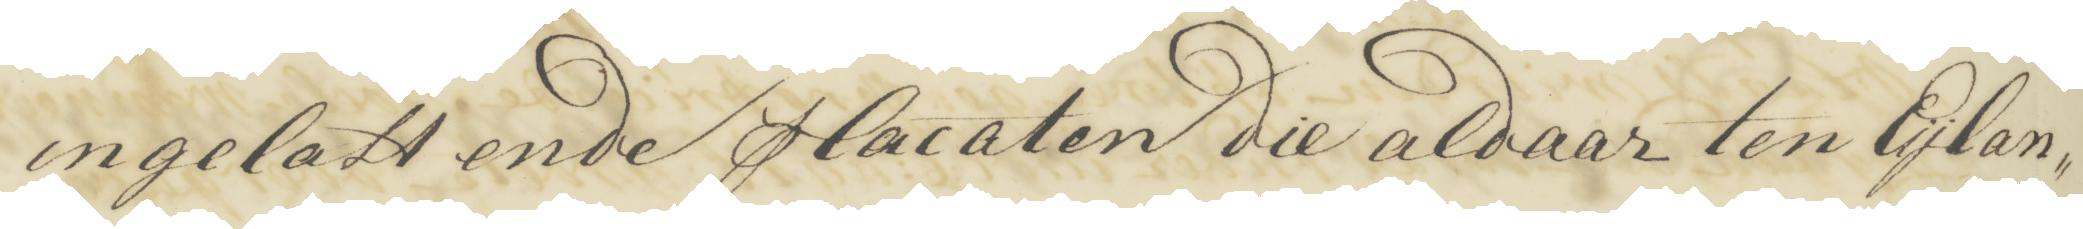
ingelast ende placaten die aldaar ten Eijlan„
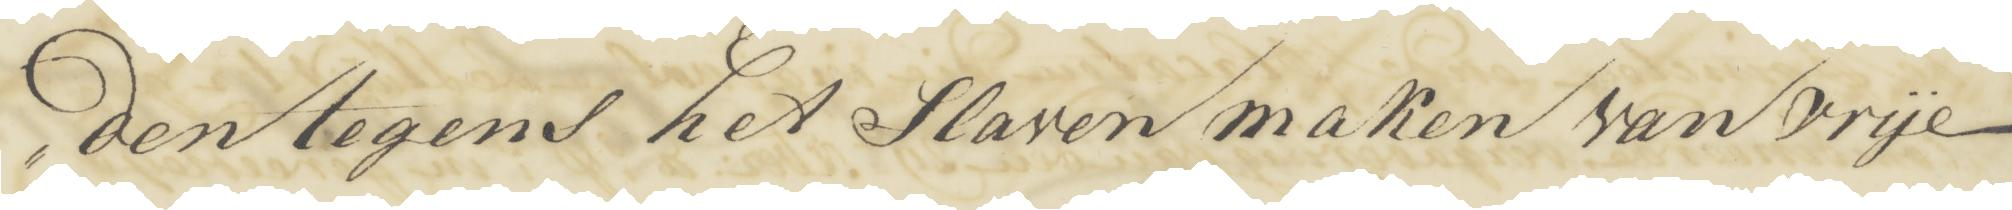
„den tegens het slaven maken van vrije
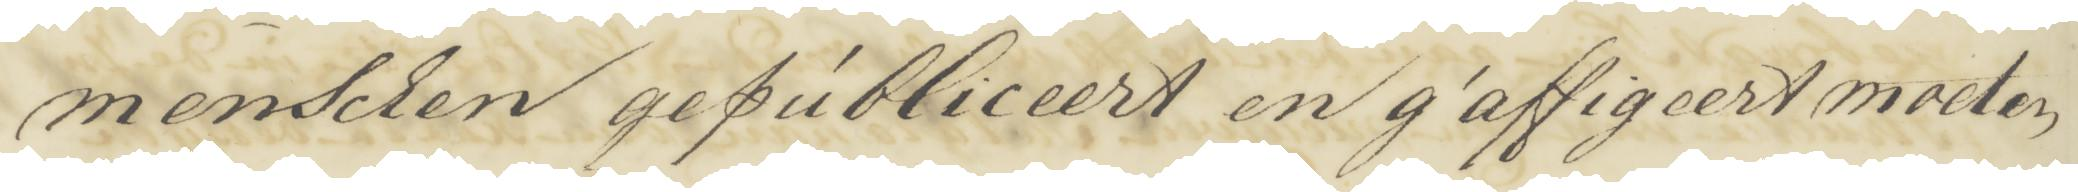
menschen gepubliceert en g’affigeert moeten
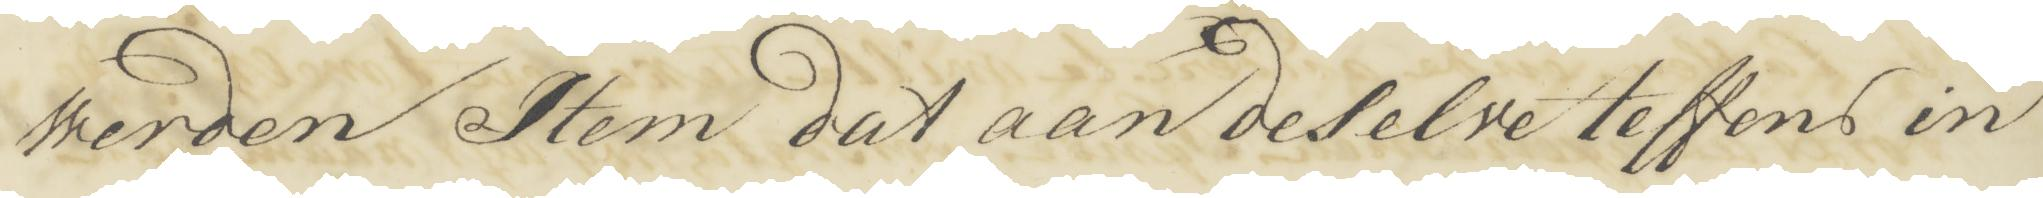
werden Item dat aan deselve teffens in
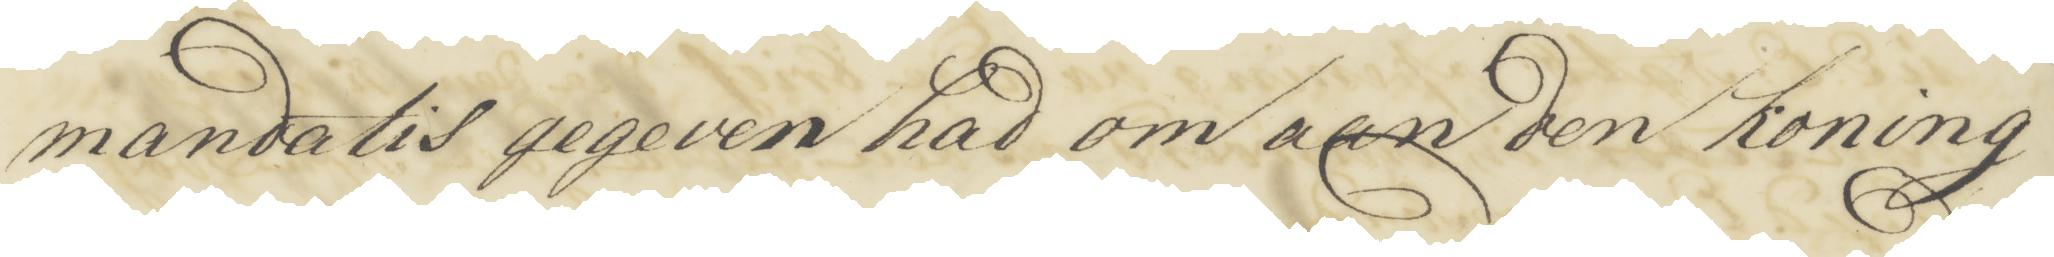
mandatis gegeven had om aan den koning
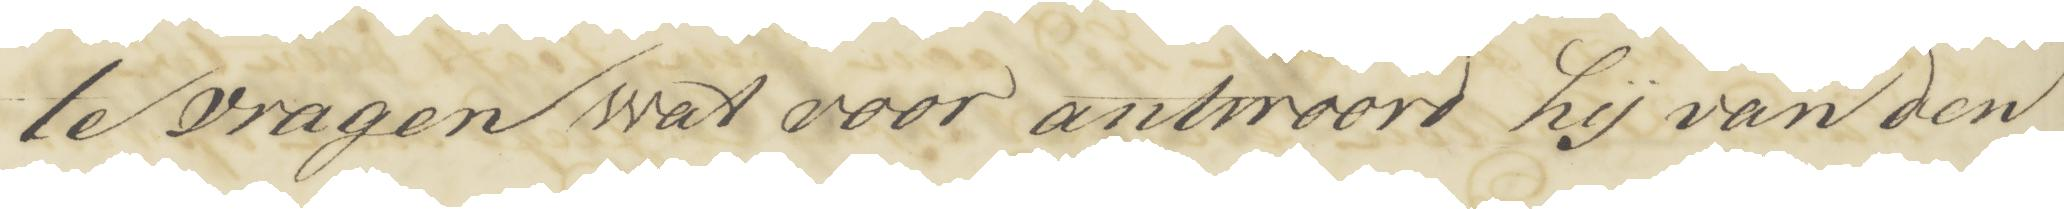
te vragen wat voor antwoord hij van den
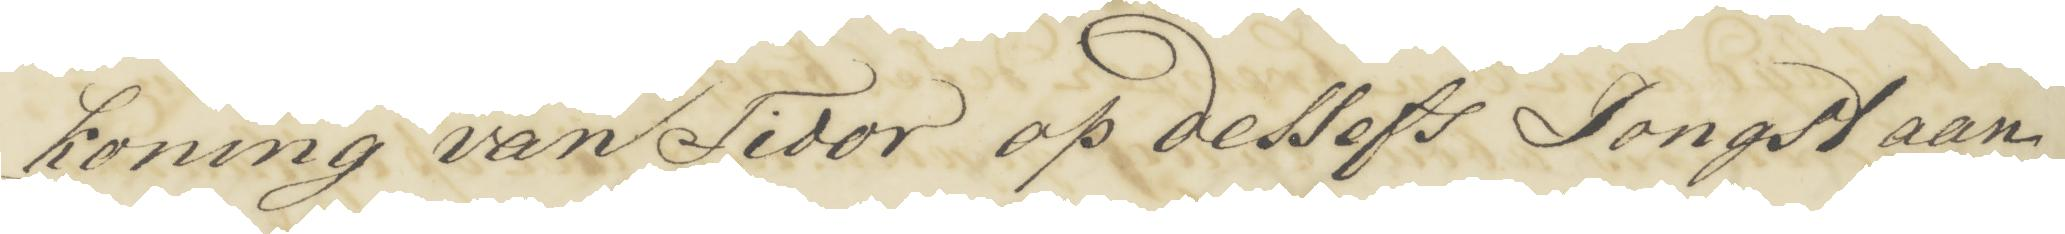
koning van Tidor op dessefs Iongst aan
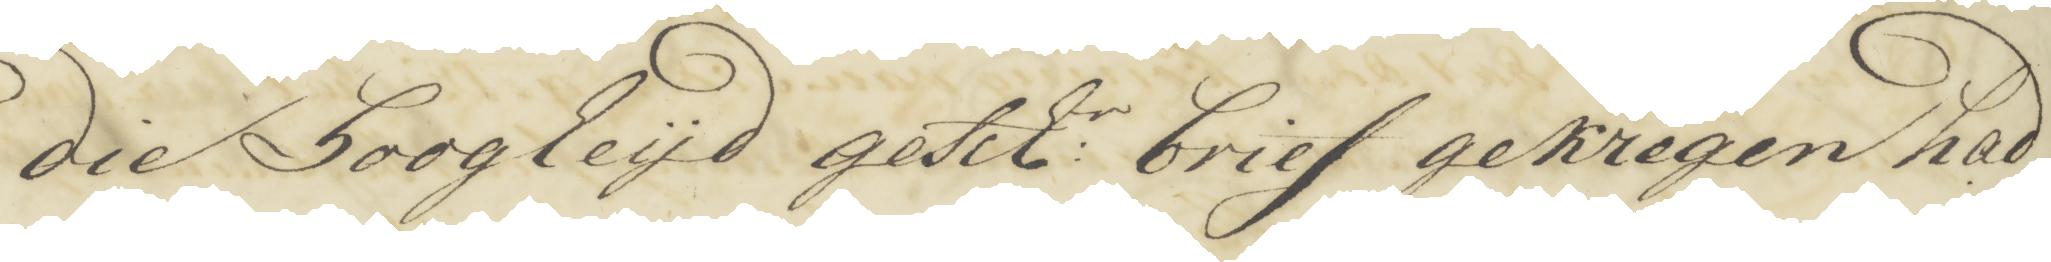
die hoogheijd gesch:r brief gekregen had
